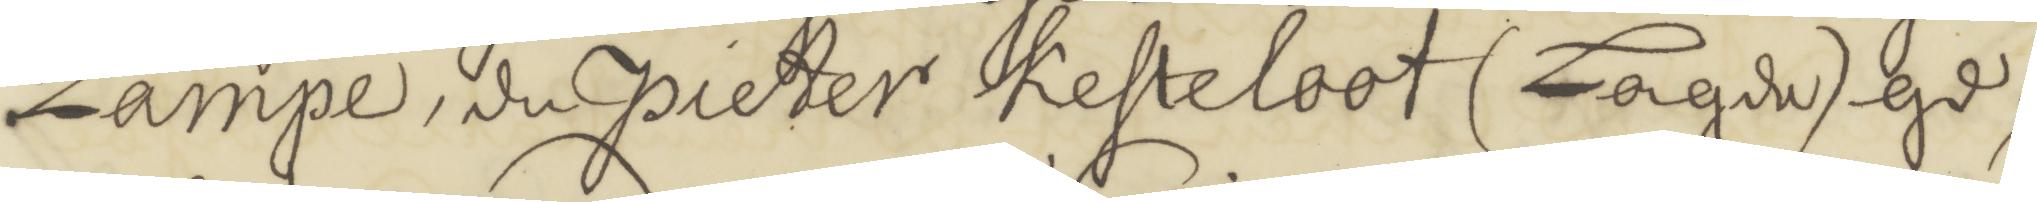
Lampe, en Pieter kesteloot (lager) ge.
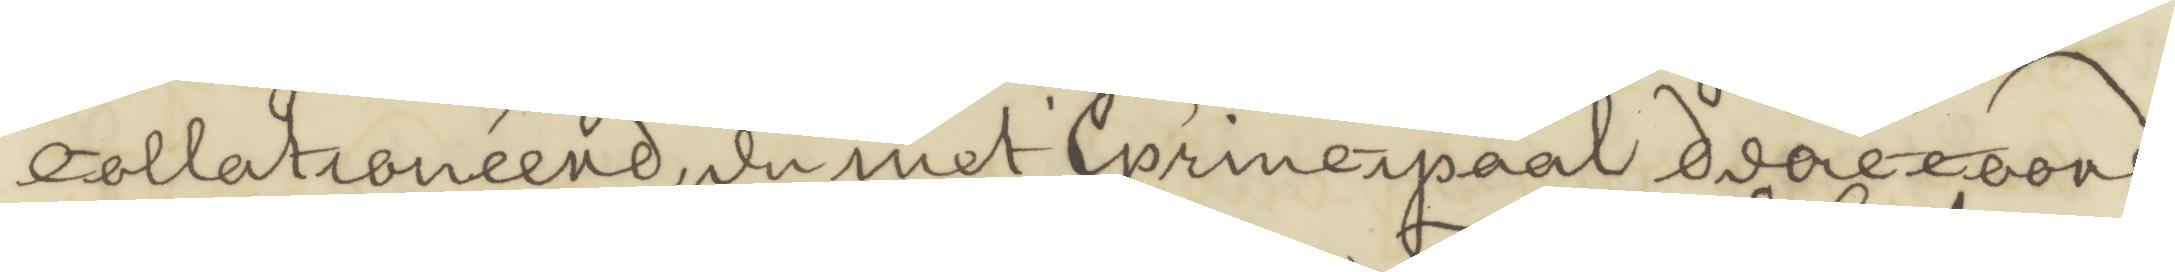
collationeerd, en met 'tprincipaal de accoord
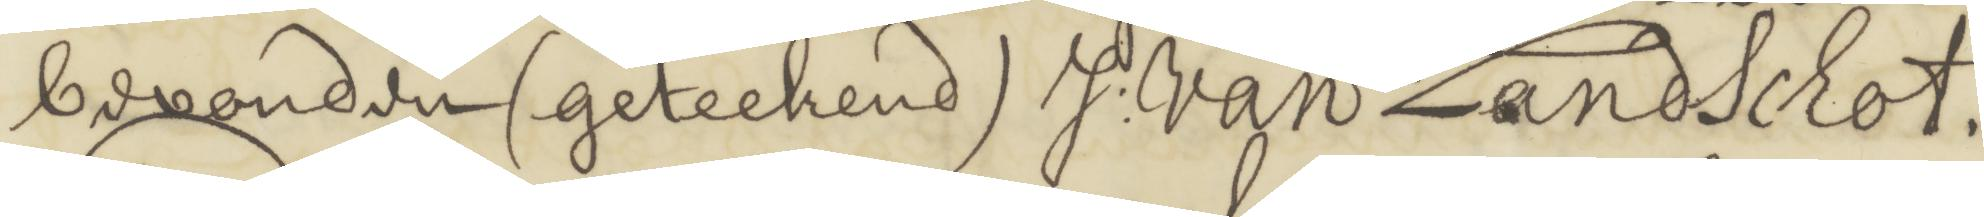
bevonden (geteekend) J: van Landschot.
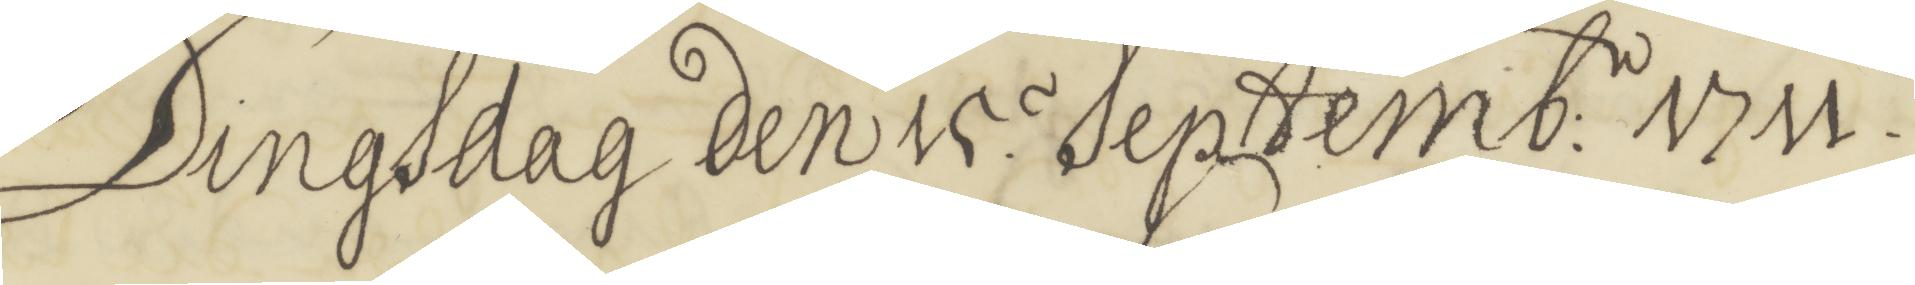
Dingsdag den 15.' Septemb:r 1711.
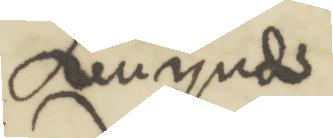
ten ynde
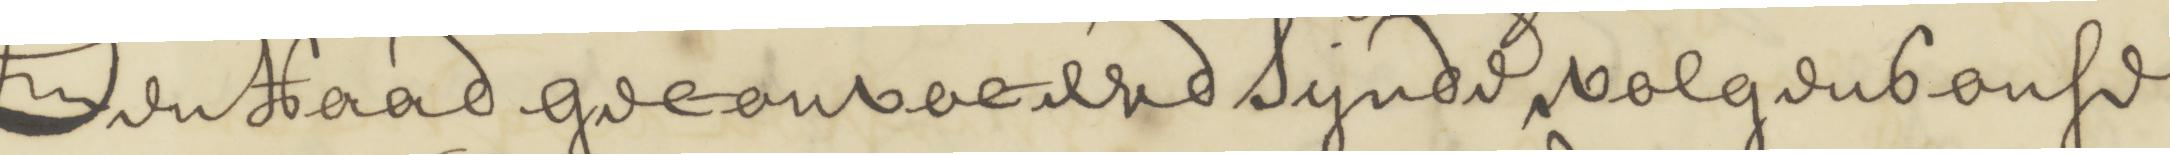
den Raad geconvoceerd sijnde, ^volgens onse
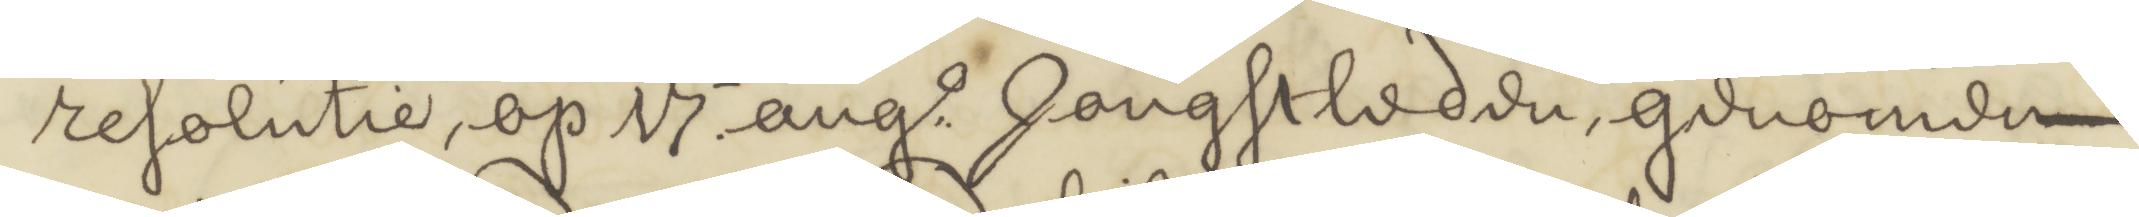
resolutie, op 17.' aug„o Jongstleden, genomen
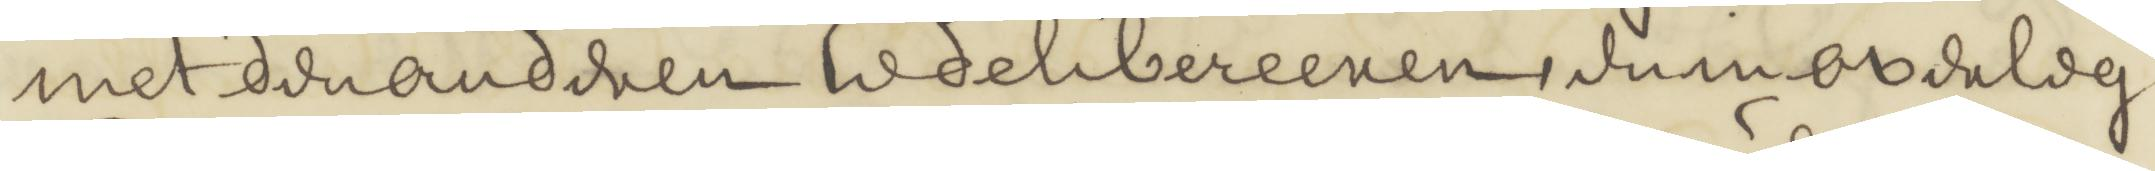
met den anderen te delibereeren, en in overleg
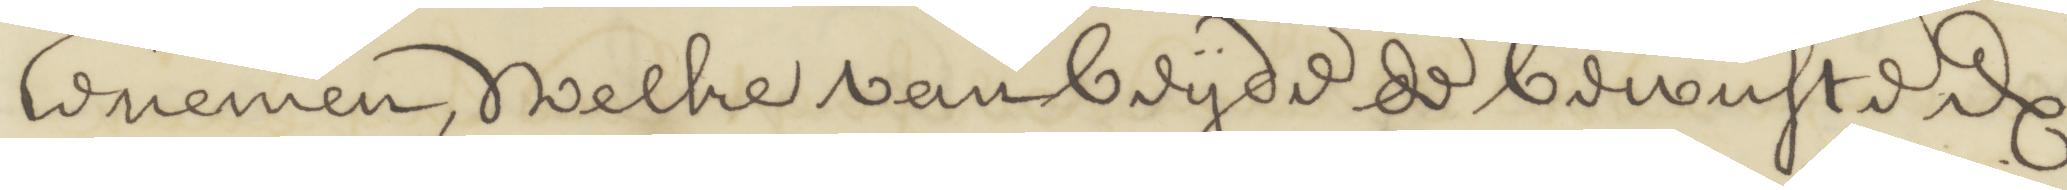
te nemen, welke van beijde de bewuste Ex.
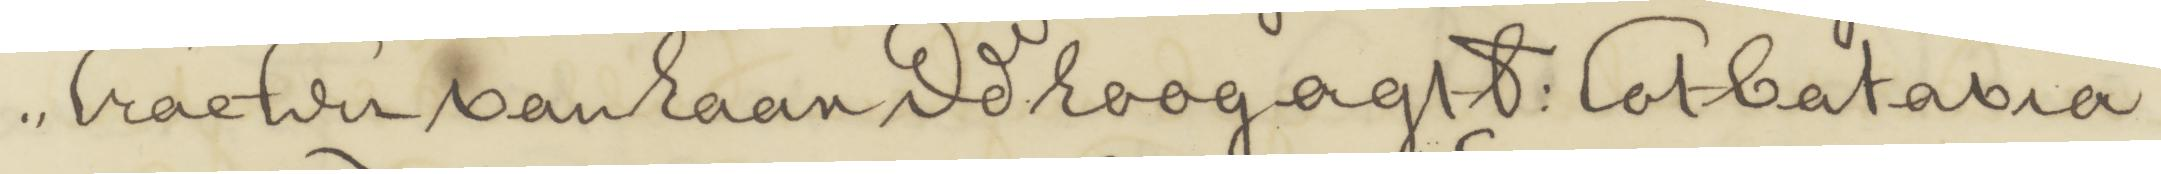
„tracten van haar Ed: hoog agtb: tot batavia
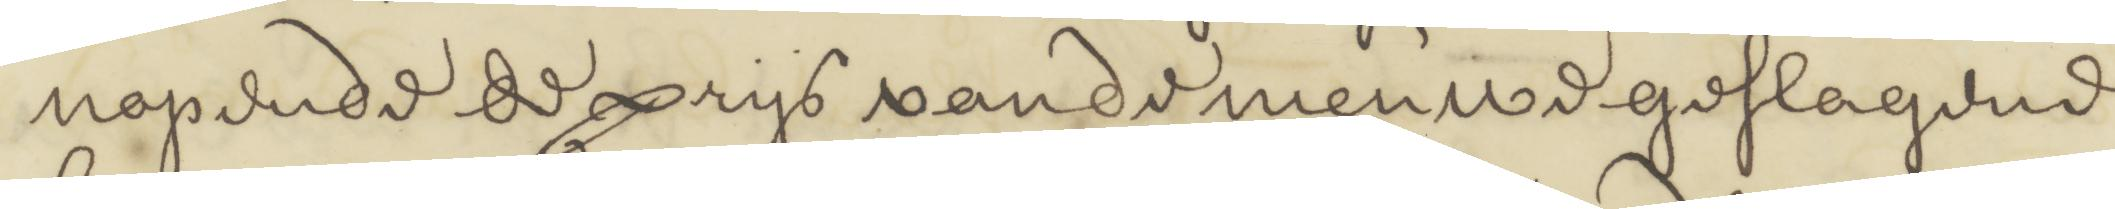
nopende de prijs van de nieuwe geslagene
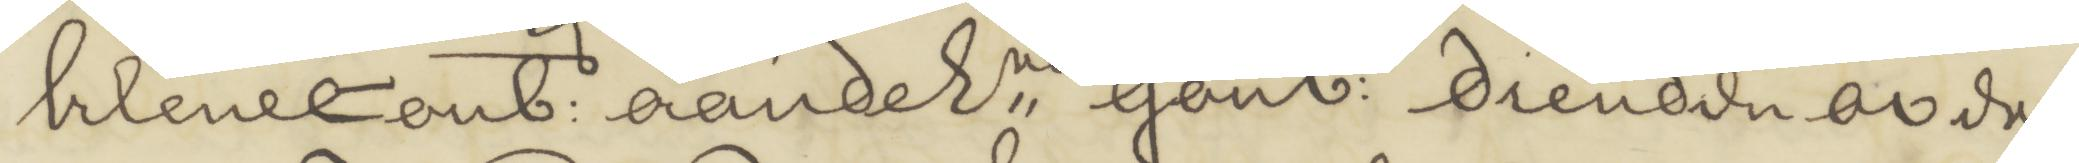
klenecenb:s aande h„ren gouv:rs dienden over.
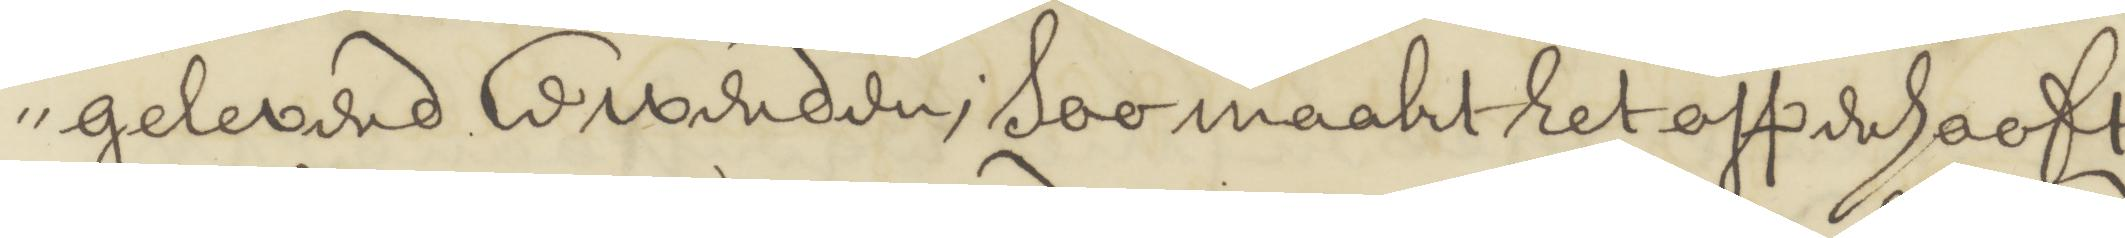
„geleverd te werden; soo maakt het opperhooft
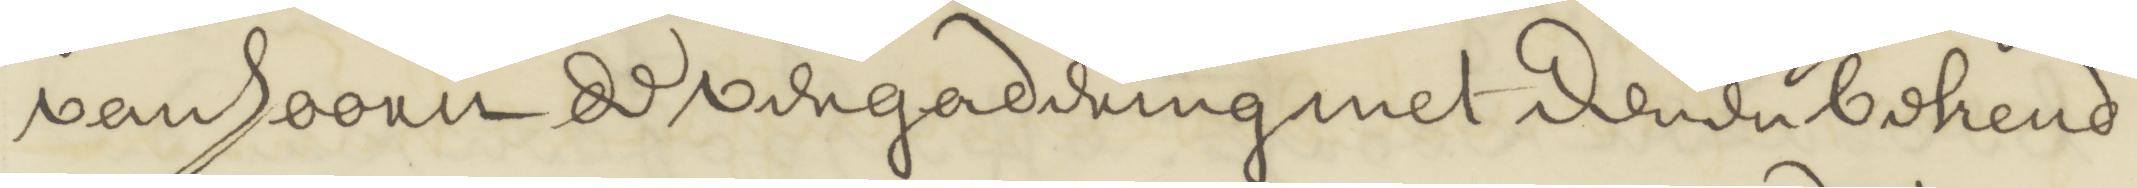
vanhoorn de vergadering met Eenen bekend
